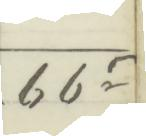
66=5
